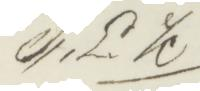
P„L K
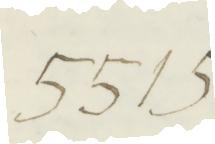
5515
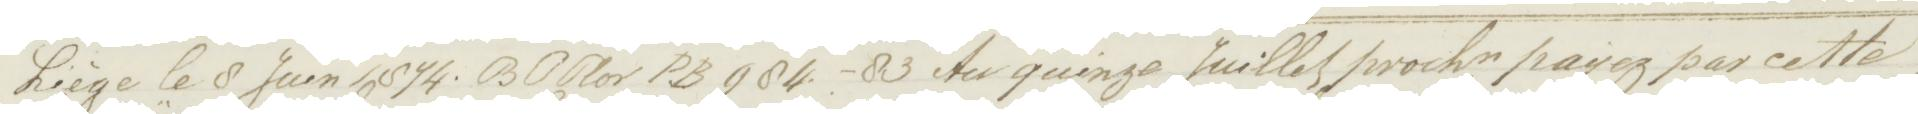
Liège le 8 Juin 1874. B O Nor PB 984 -83 Au quinze Juillet prochr paijez par cette
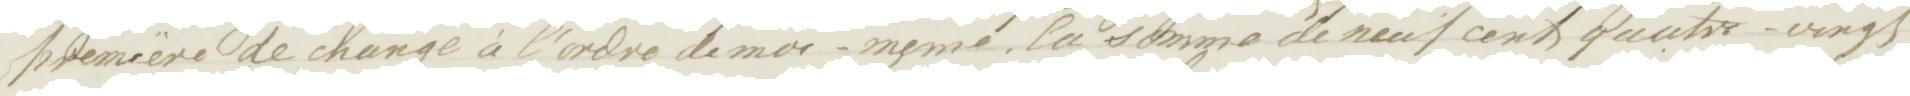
première de change à l'ordre de moi -meme, la somme de neuf cent quatre-vingt
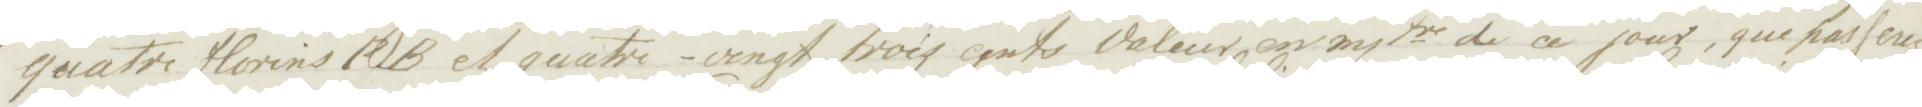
quatre florins P B et quatre-vingt trois cents valeur, en mit-re de ce jour, qui passerez
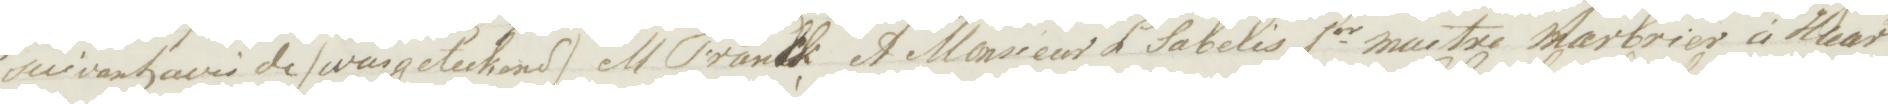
suivants avis de (was geteekend) M Franck A Monsieur L Sabelis J-er maitre Marbrier à Haar
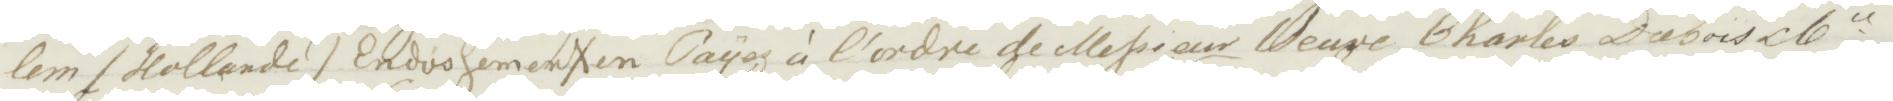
lem / Hollande) Endossementen Paijez à l'ordre de Messieur Veuve Charles Dubois & C.ie
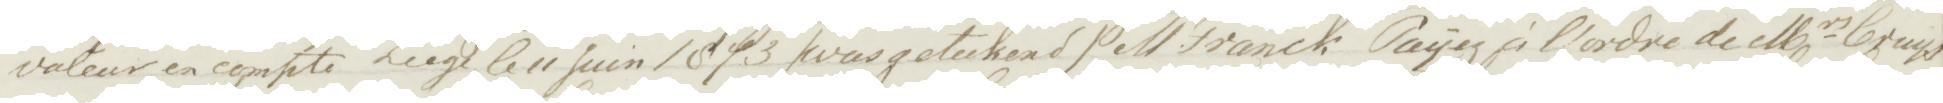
valeur en compte Liege le 11 Juin 1873 (was geteekend) M Franck Paijez à l'ordre de M=rs Cruys
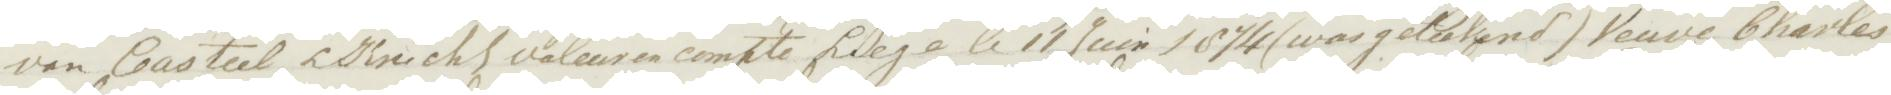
van Casteel & Kreicht valeur en compte Liege le 11 Juin 1874 (was geteekend) Veuve Charles
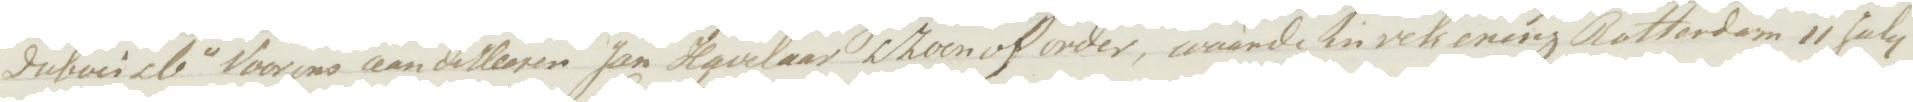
Dubois & Cie Voor ons aan de Heeren Jan Hairlaar & Zoon of order, waarde in rekening Rotterdam 11 July
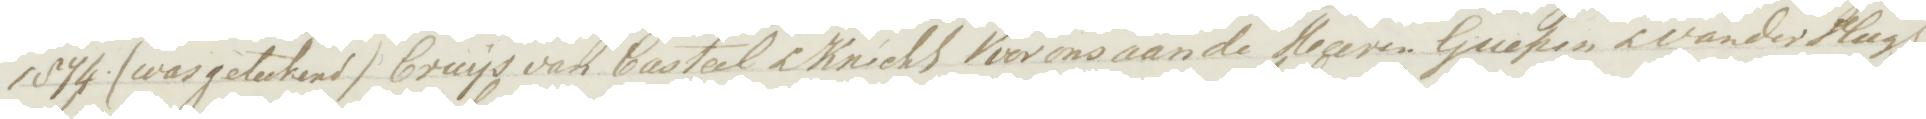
1874. (was geteekend) Cruijs van Casteel & Kricht Voor ons aan de Heeren Guepen & vander Vlugt
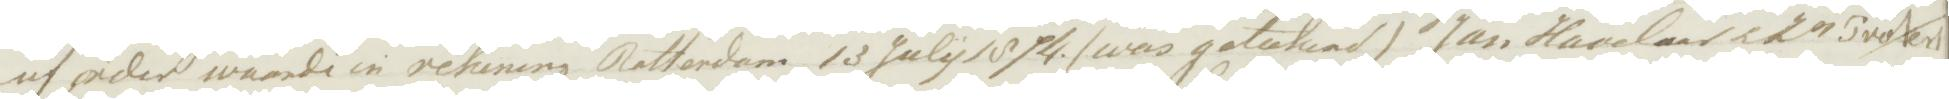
of order waarde in rekening Rotterdam 13 Julij 1874. (was geteekend) Jan Haselaar & Zn Protest
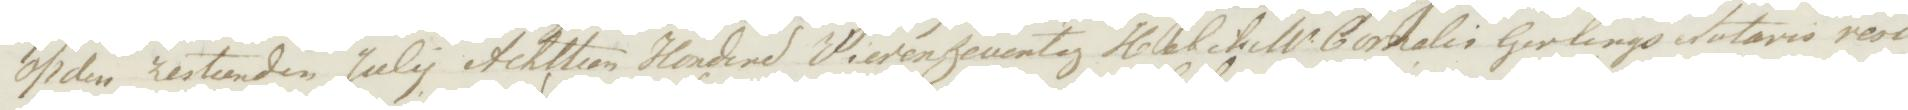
op den zestienden Julij Achttien Honderd Vierenzeventig Heb ik Mr Cornelis Gerlings Notaris resi
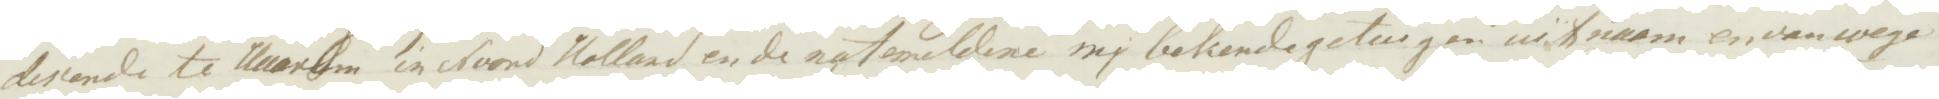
derende te Haarlem in Noord Holland en de natemeldene mij bekende getuigen uit naam en van wege
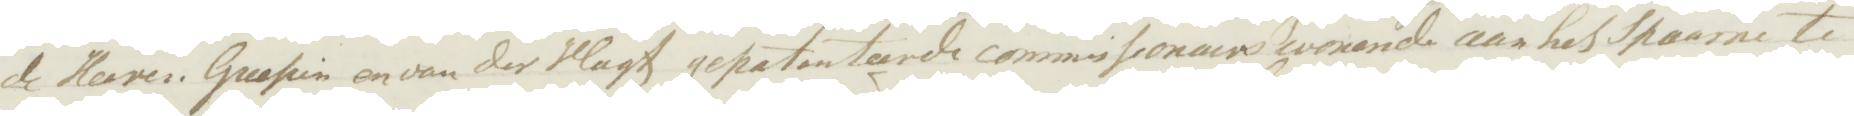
de Heeren Guepin en van der Vlugt gepatenteerde commissionairs wonende aan het spaarne te
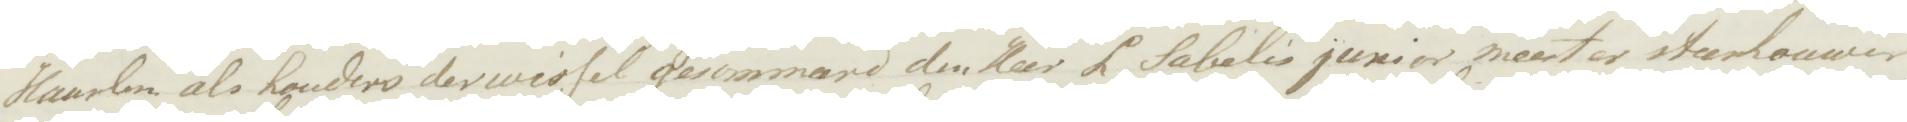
Haarlem als houders der wissel gesommeerd den Heer L Sabelis iunior meester steenhouwer
